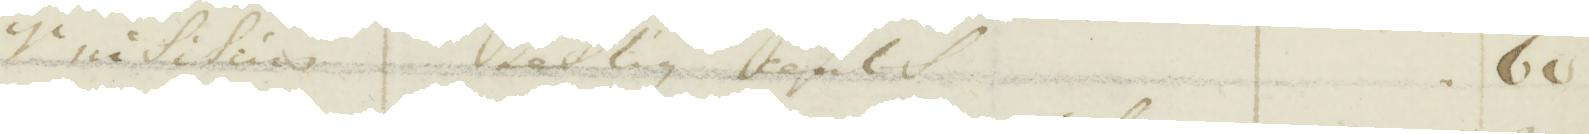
V visilius Zestig cents „ 60
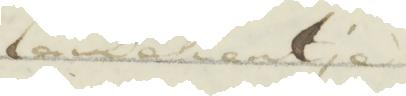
Een Dekentje
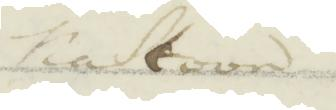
Kastoor
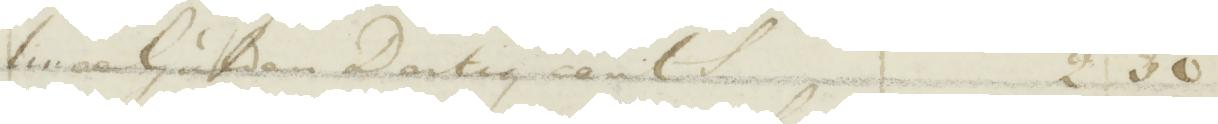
twee Gulden Dertig cents 2 30
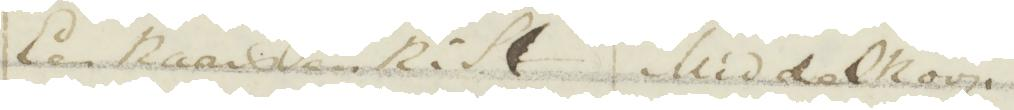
Een Kaarsenkist Middelkoop
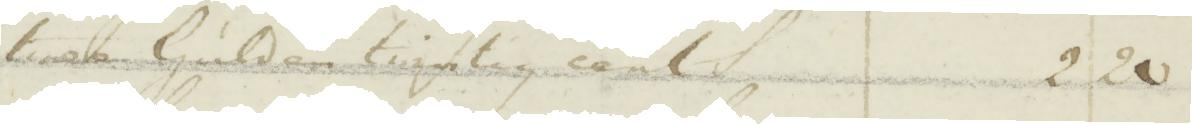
twee Gulden twintig cents 2 20
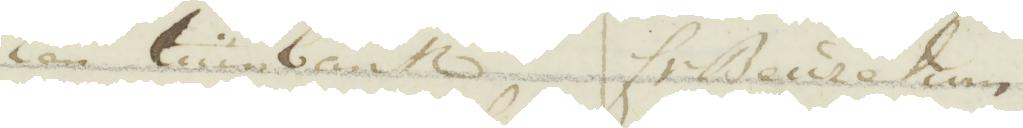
Een tuinbank f v Beuzekom
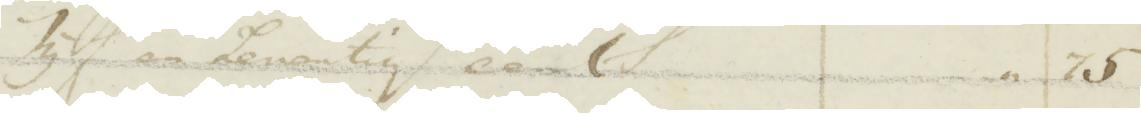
vijf en Zeventig cents „ 75
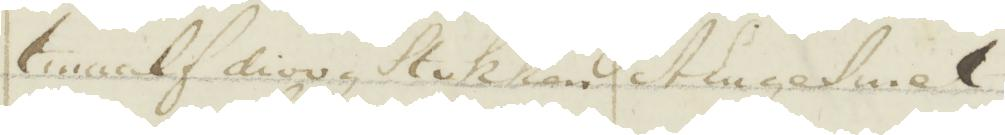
twaalf divve Stukken A Engesmet
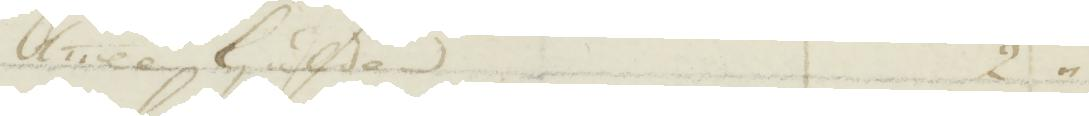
twee Gulden 2 „
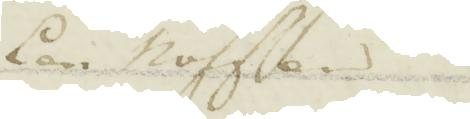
Een Koffer
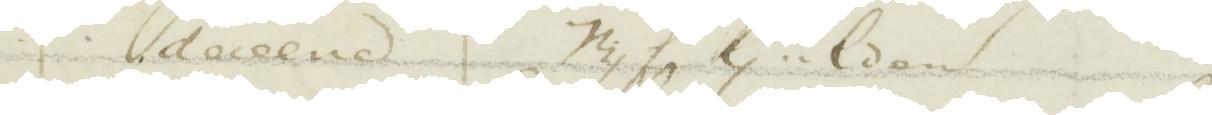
dezelve vijf Gulden
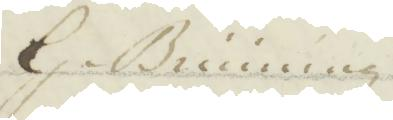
G. Bruining
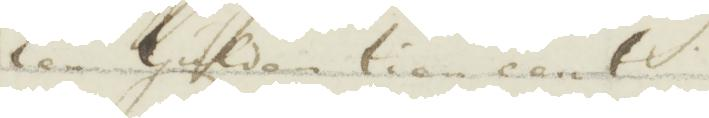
Een Gulden tien cents.
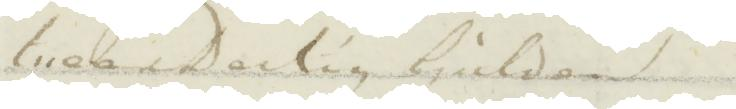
twee en Dertig Gulden
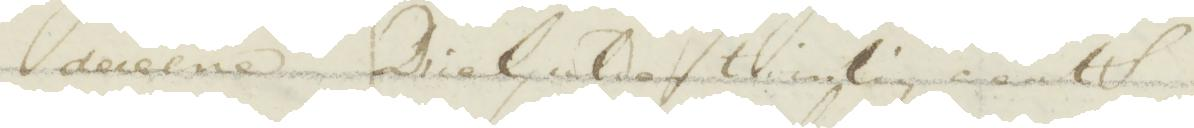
dezelve Drie Gulden twintig cents
